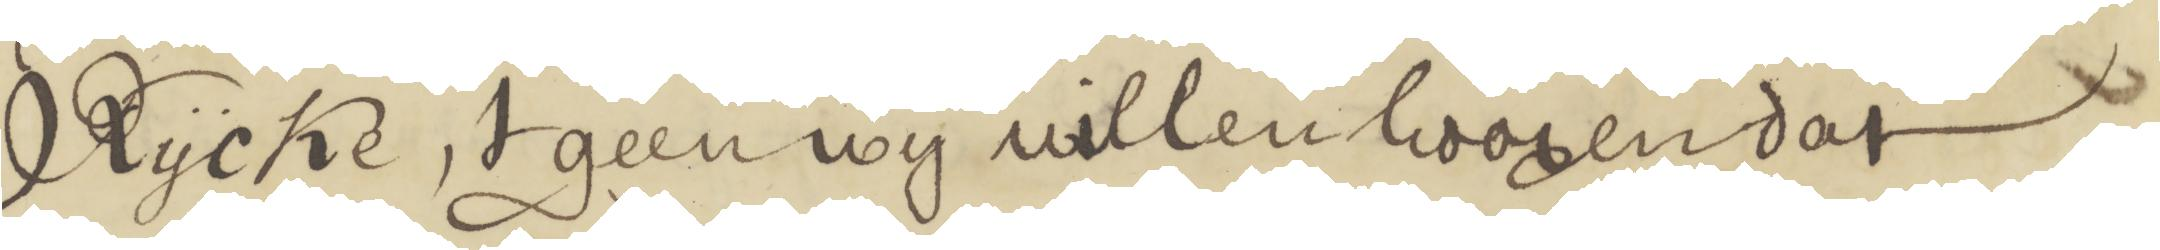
Rijcke, 't geen wij willen hoopen dat
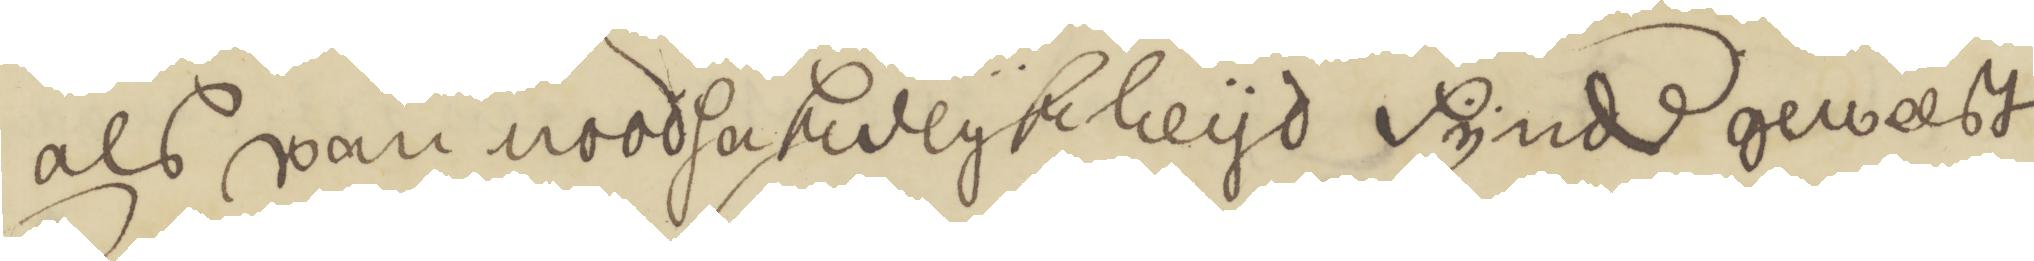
als van noodsakelijkheijd sijnde geweest
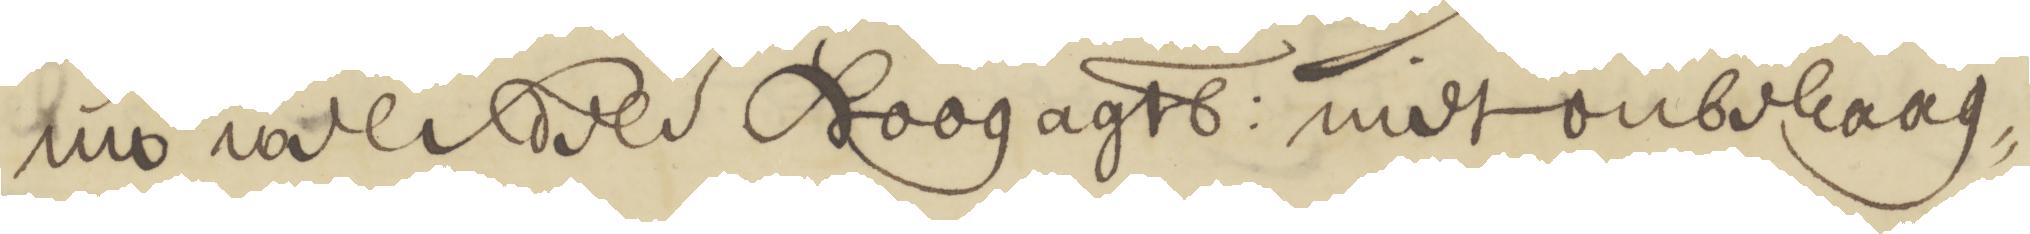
uw wel Edele Hoog agtb: niet onbehaag„
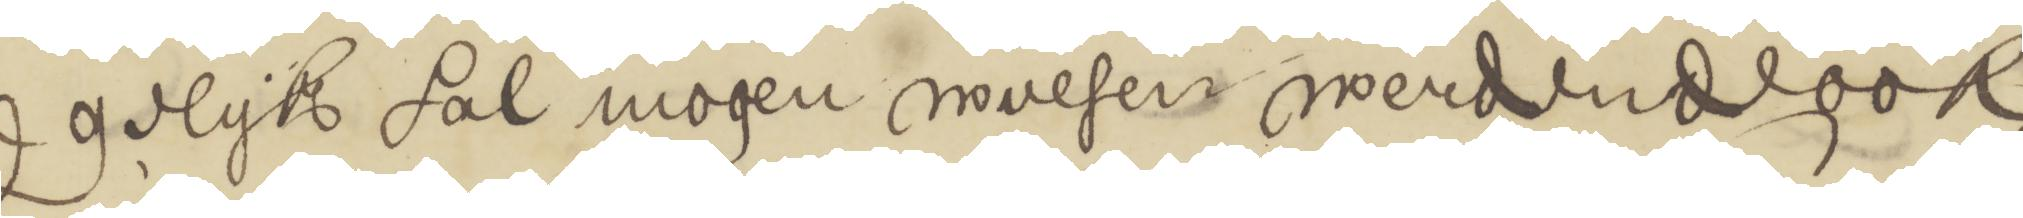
gelijk sal mogen weesen werdende ook
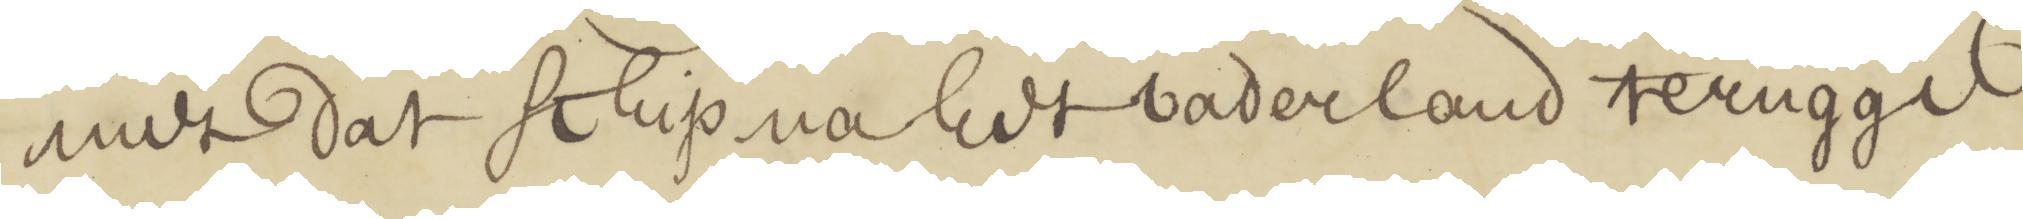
met dat schip na het vaderland terugge
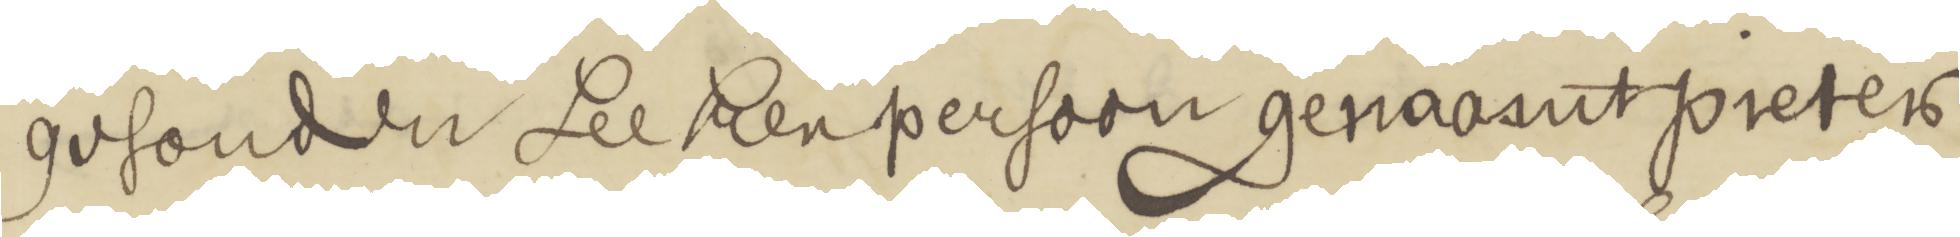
gesonden seeker persoon genaamt pieter
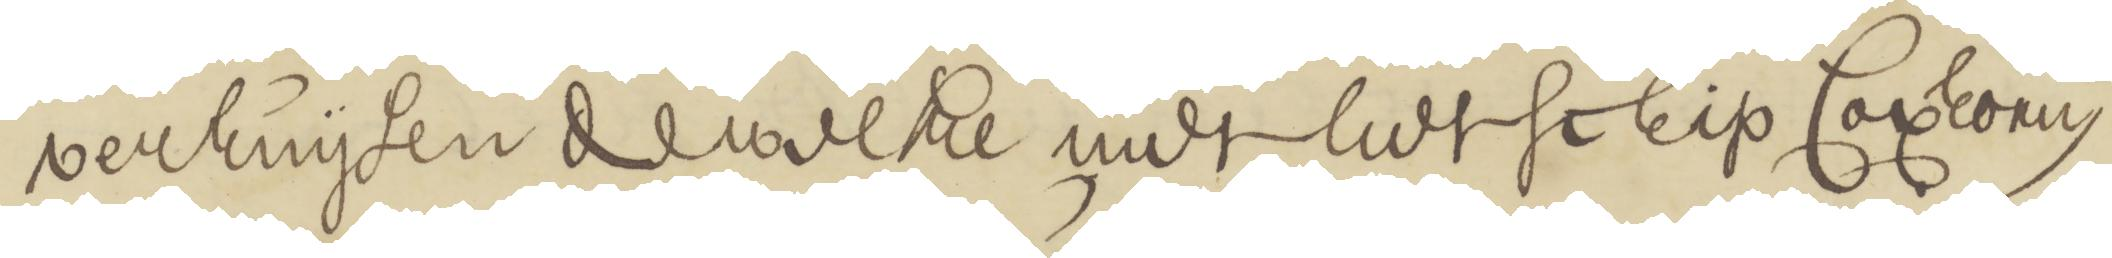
verhuijsen dewelke met het schip Coxhorn
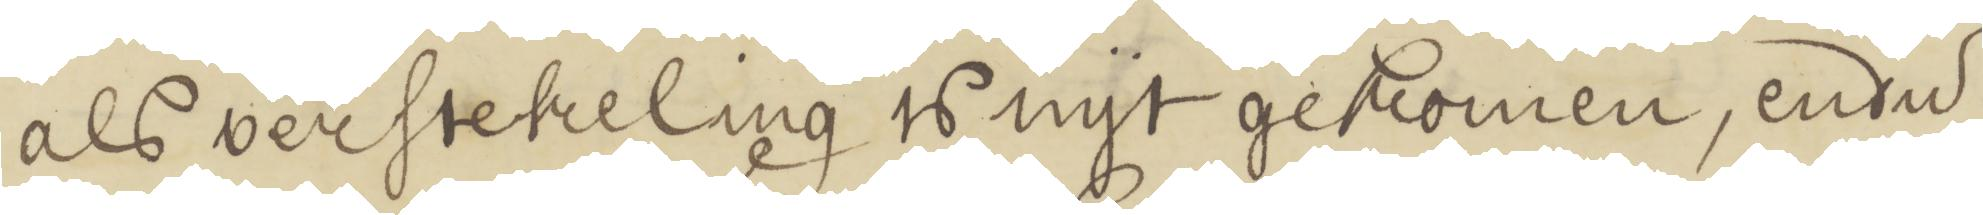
als verstekeling is uijt gekomen, en die
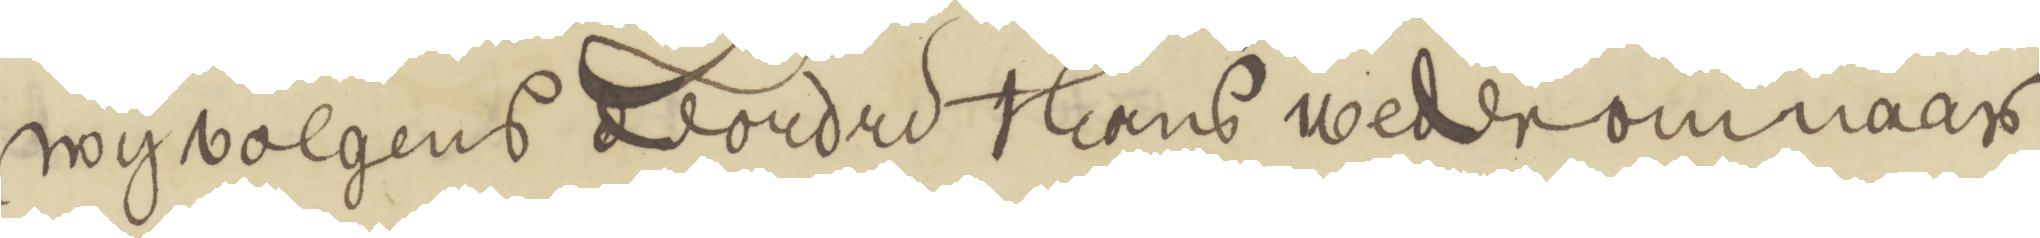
wij volgens de ordre thans wederom naar
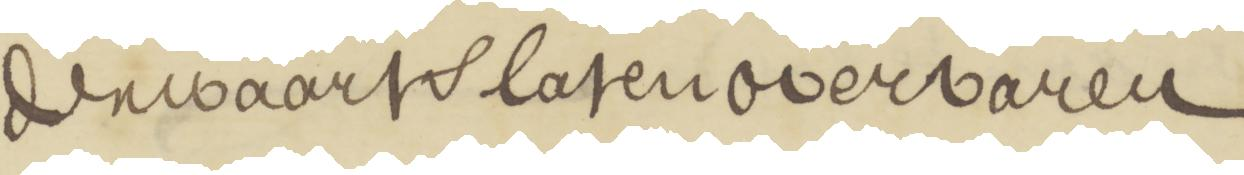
derwaarts laten overvaren
